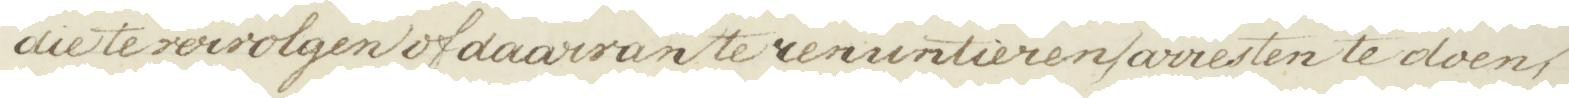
die te vervolgen of daarvan te renuntieren, arresten te doen,
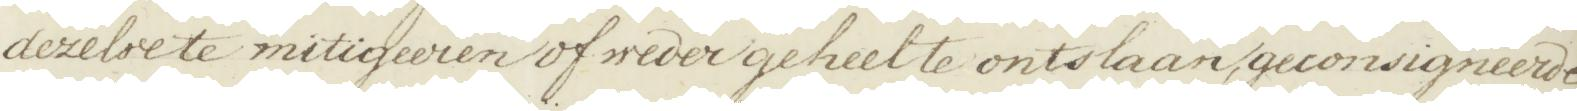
dezelve te mitigeeren of weder geheel te ontslaan, geconsigneerd
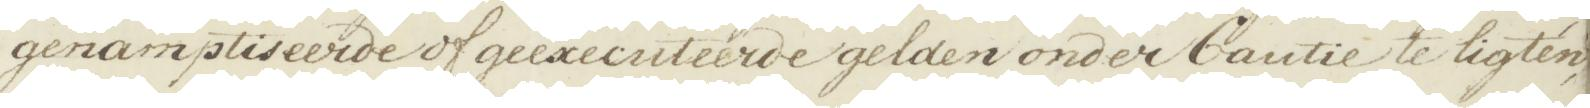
genamptiseerde of geëxecuteerde gelden onder Cautie te ligten,
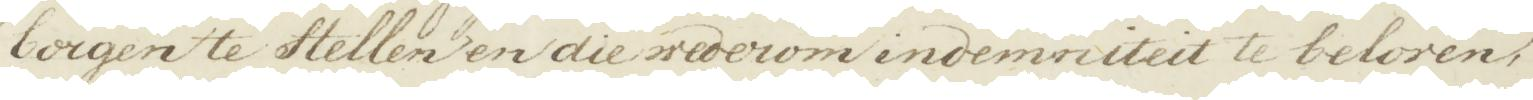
borgen te stellen en die wederom indemniteit te beloven,
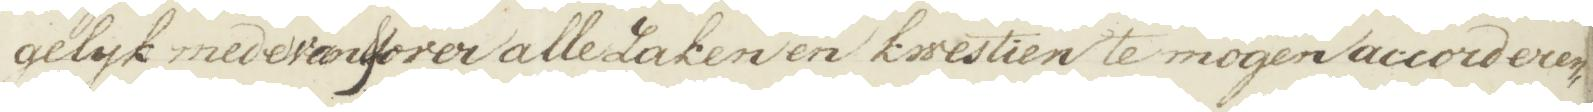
gelyk mede van & over alle zaken en kwestien te mogen accorderen,
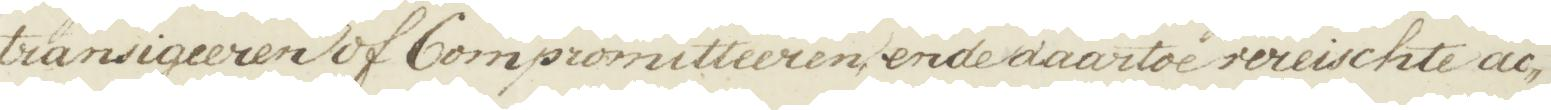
transigeeren of Compromitteeren, ende daartoe vereischte ac„
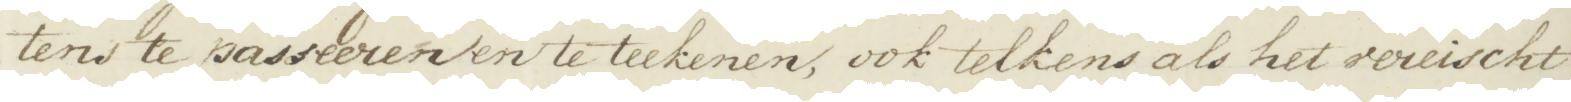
tens te passeeren en te teekenen, ook telkens als het vereischt
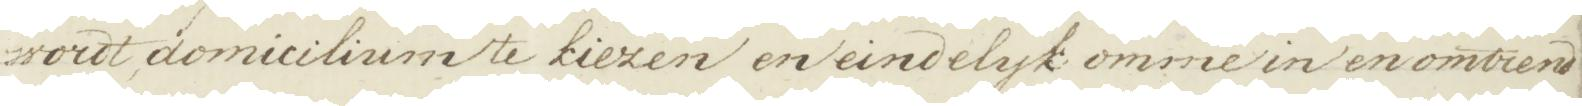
wordt, domicilium te kiezen en eindelyk omme in en omtrend
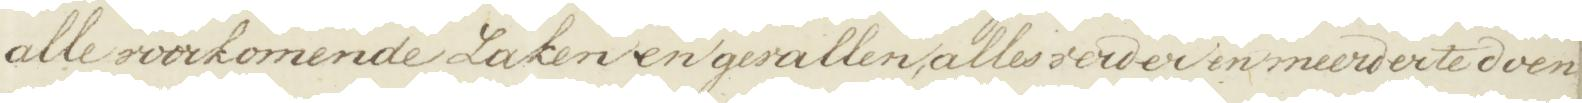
alle voorkomende zaken en gevallen, alles verder en meerder te doen
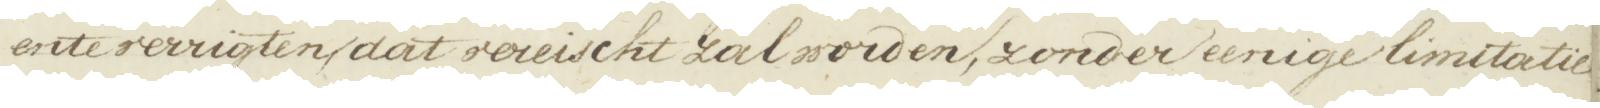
ente verrigten, dat vereischt zal worden, zonder eenige limitatie
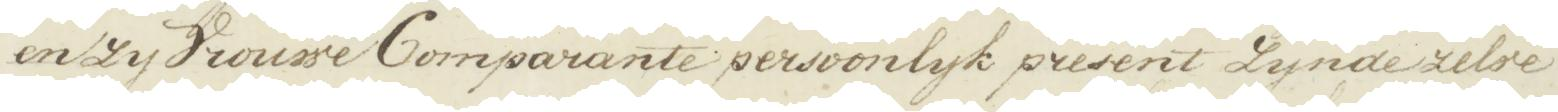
en zy Vrouwe Comparante persoonlyk present zynde zelve
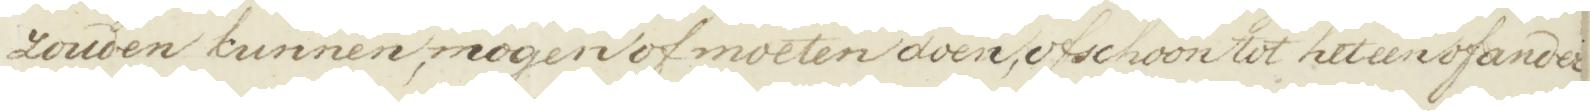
zouden kunnen, mogen of moeten doen, ofschoon tot het een of ander
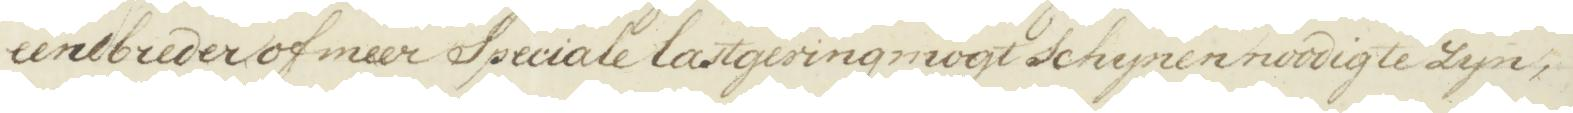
eentbreder of meer Speciale lastgering mogt schynen noodig te zyn,
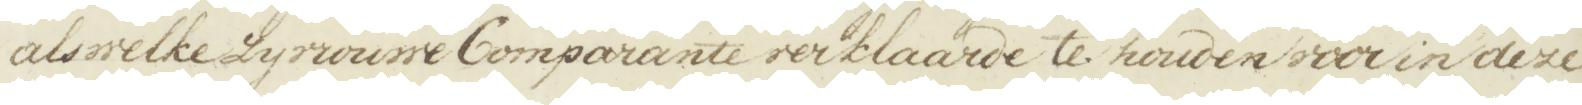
als welke Zy vrouwe Comparante verklaarde te houden voor in deze
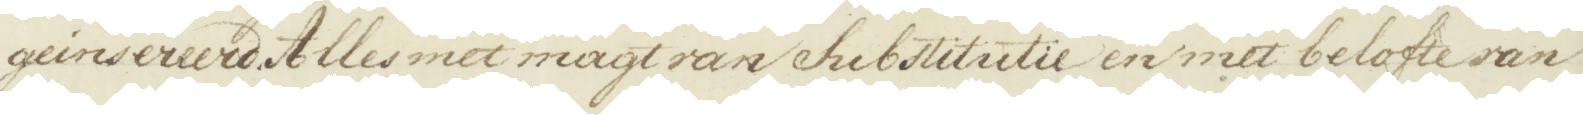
geinsereerd Alles met magt van Substitutie en met belofte van
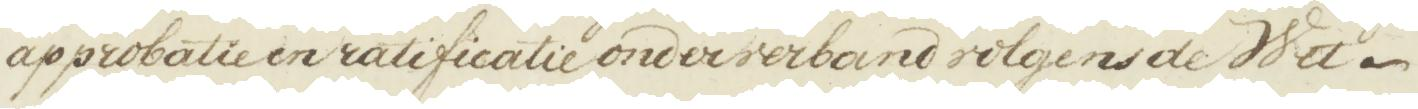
approbatie en ratificatie onder verband volgens de Wet _
